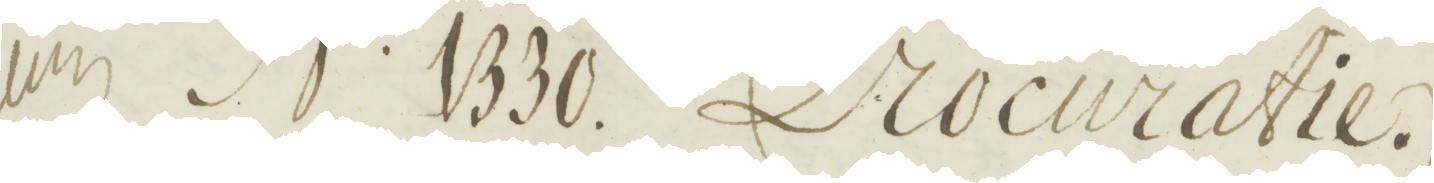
N:o 1330. Procuratie.
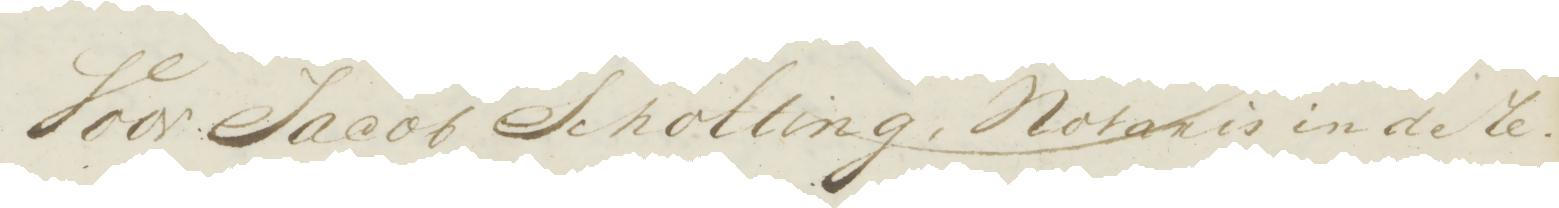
Voor Jacob Scholting, Notaris in de Re
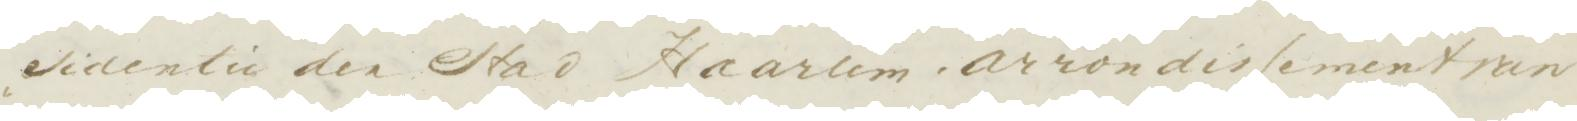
sidentie der Stad Haarlem, Arrondissement van
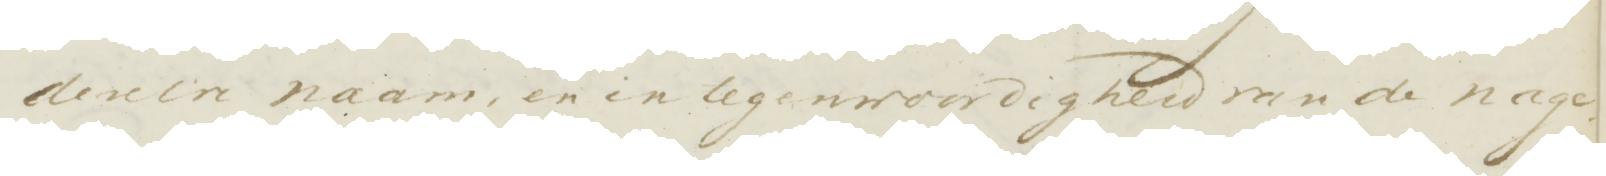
deselve naam, en in tegenwoordigheid van de nage-
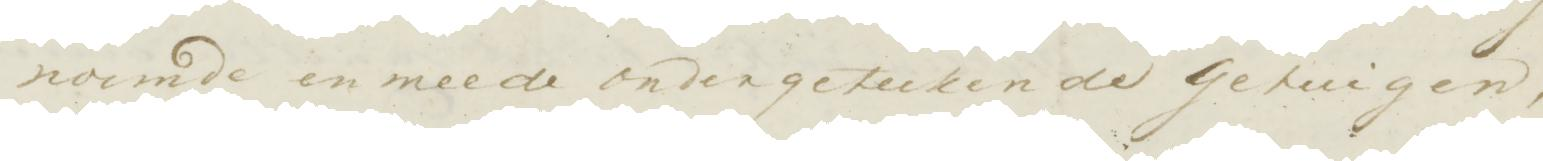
noemde en meede ondergeteekende Getuigen
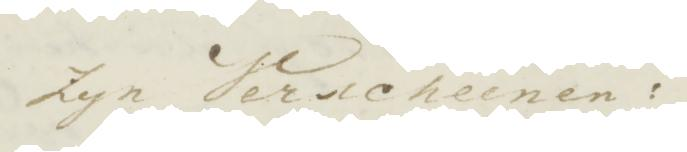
zyn Verscheenen:
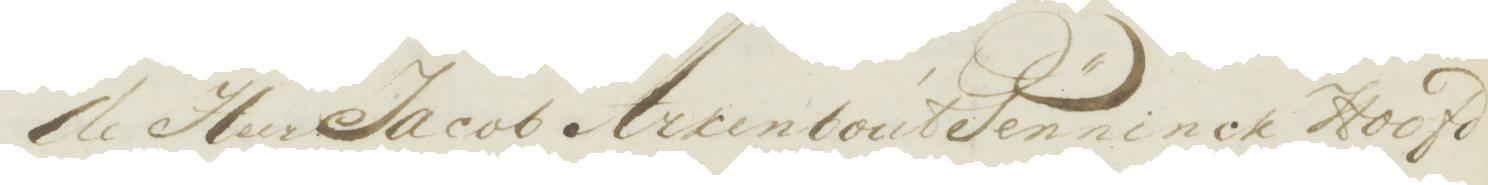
de Heer Iacob Arkenbout Penninck Hoofd
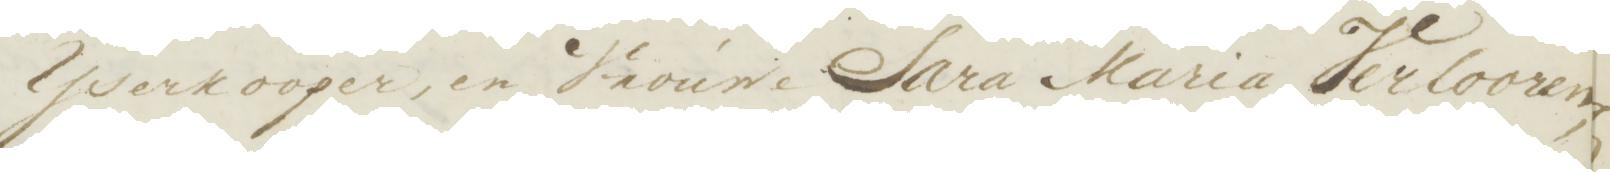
IJserkooper, en Vrouwe Sara Maria Verlooren,
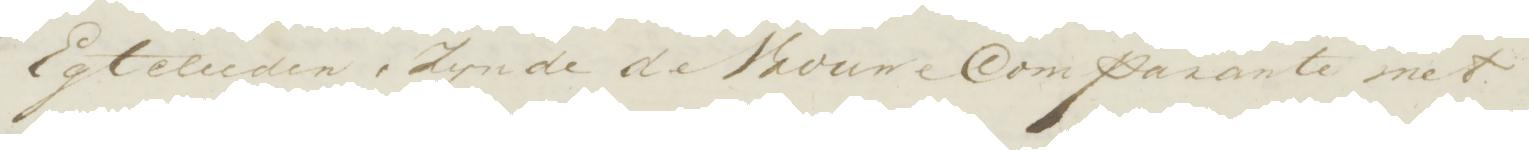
Egtelieden, Zynde de Vrouwe Comparante met
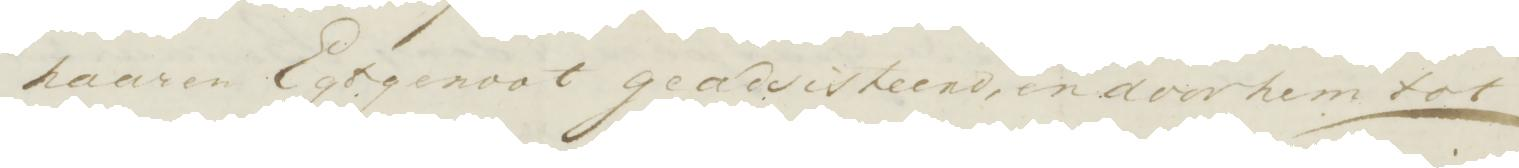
haaren Egtgenoot geadsisteerd, en door hem tot
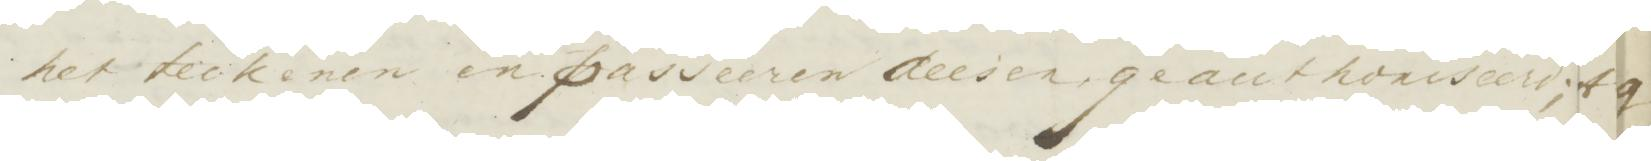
het teekenen en passeeren deeser geauthoriseerd;
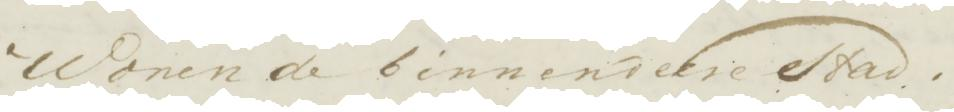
Wonen de binnen deese Stad.
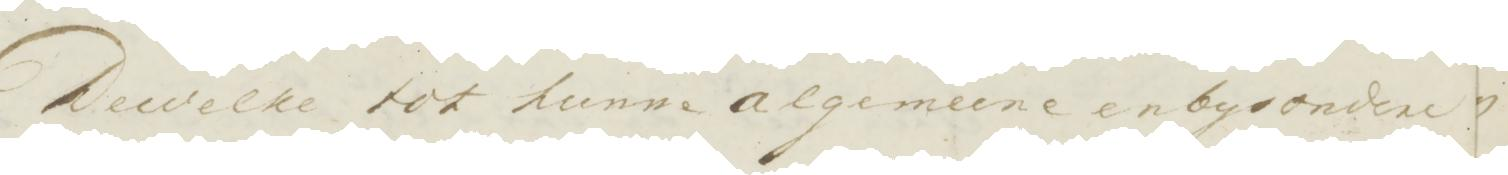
Dewelke tot kunne algemeene en bysondere
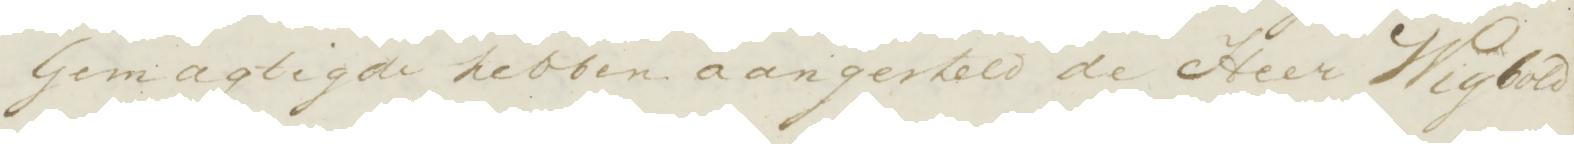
Gemagtigde hebben aangesteld de Heer Wigbold
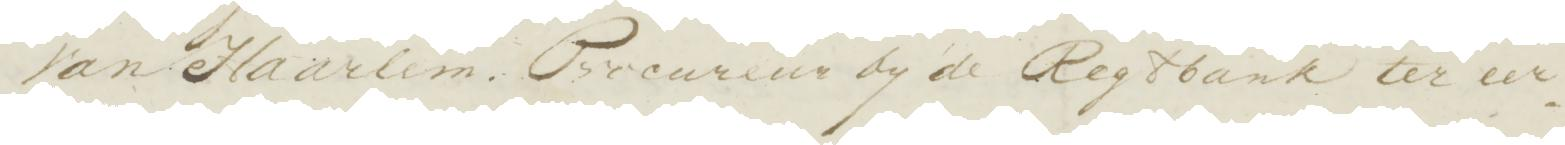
van Haarlem, Procureur by de Regtbank ter eer„
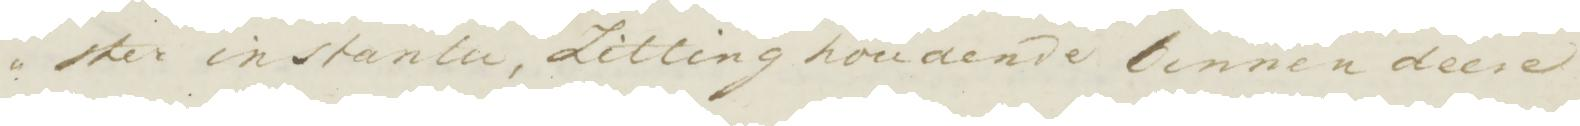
„ster instantie, zitting houdende binnen deese
